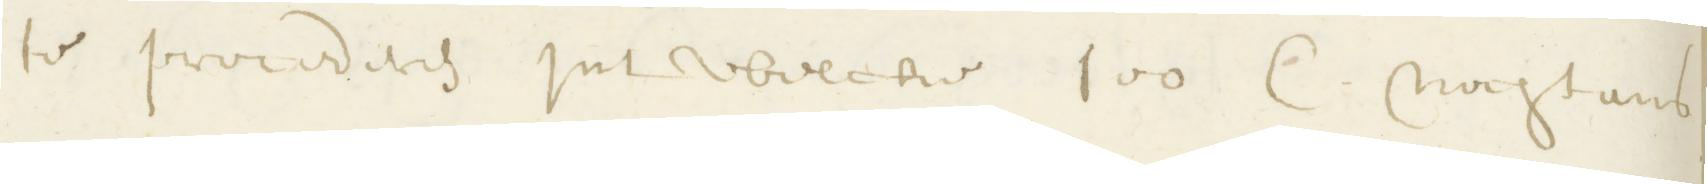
te procederen jnt welcke soo (nochtans
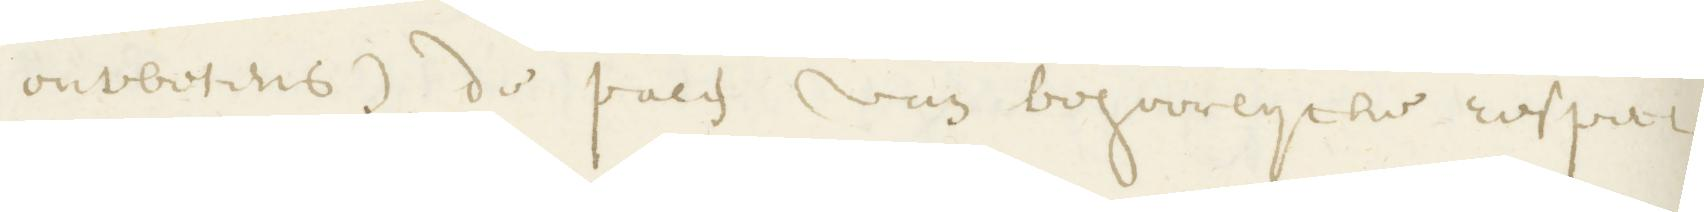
onwetens) de palen van behoorlycke respect
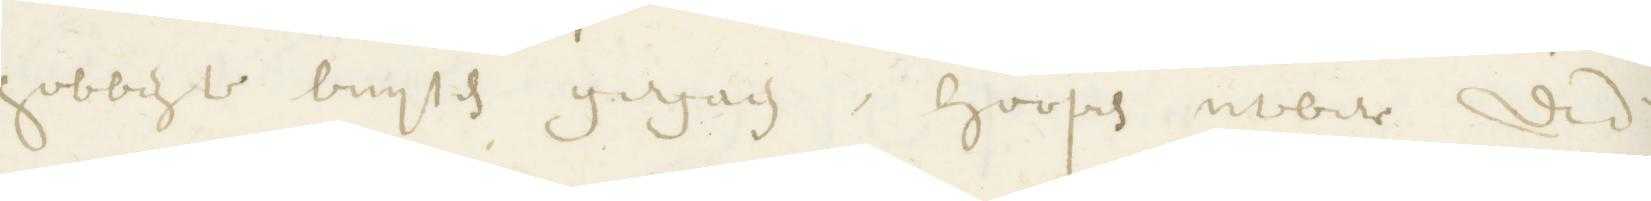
hebben te buyten gegaen, hoopen uwer Ede
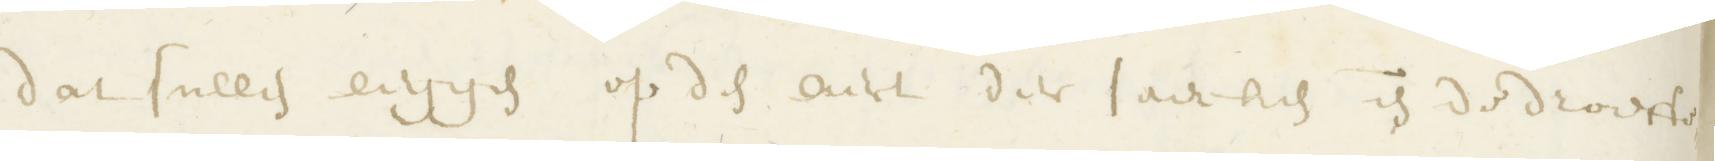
dat sullen leggen op den aert der saecken ende de droeffe
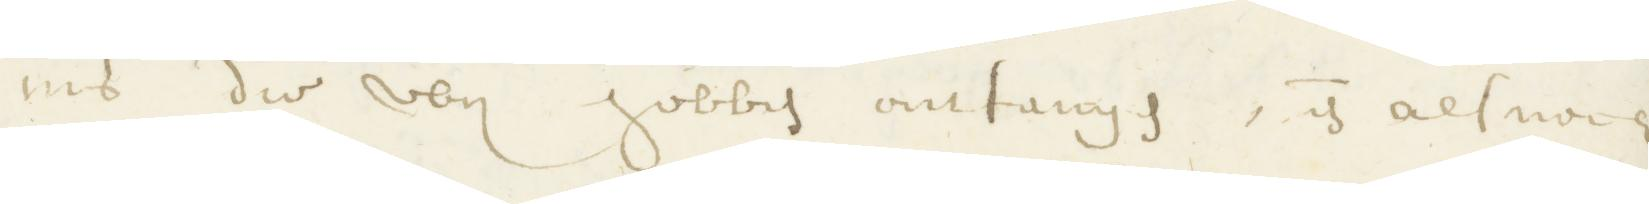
nis die wy hebben ontfangen, ende als noch
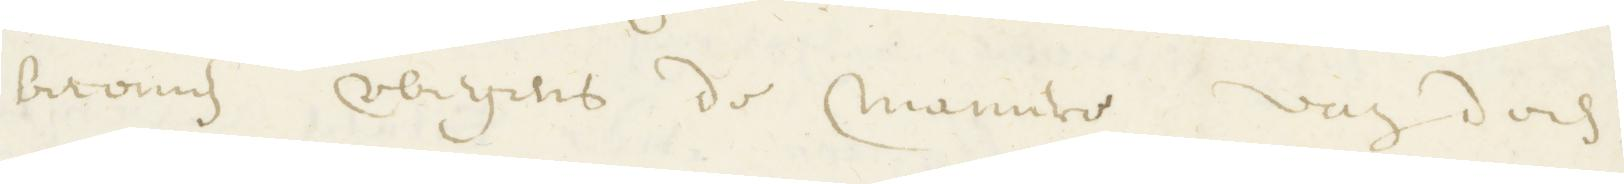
becomen wegens de maniere van doen
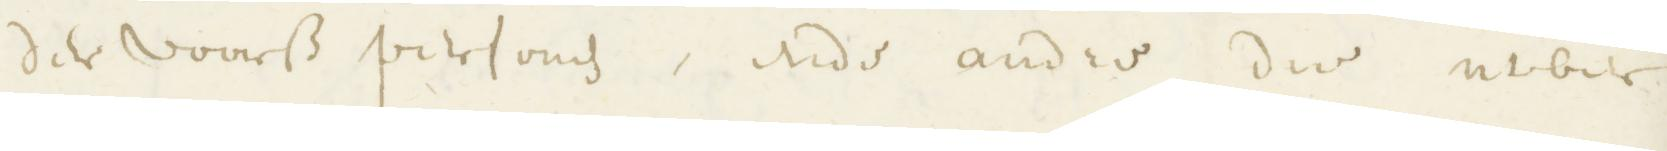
der voorsz personen, ende andre die uwer
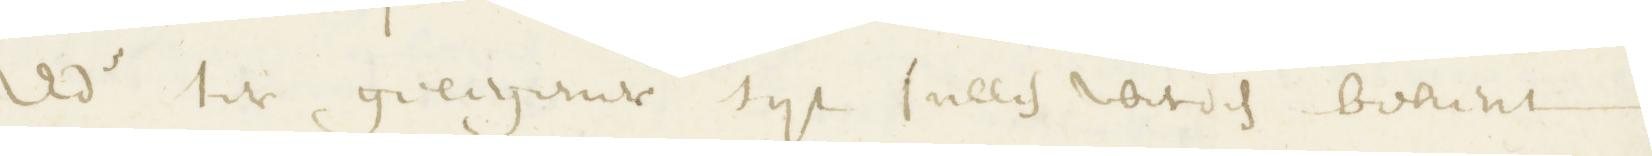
Ede ter gelegener tyt sullen werde bekent
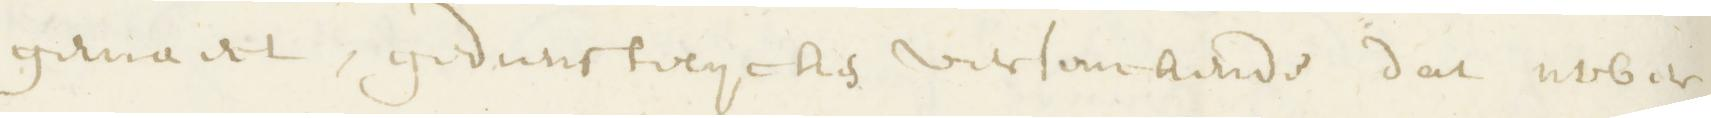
gemaect, gedienstelycken versouckende dat uwer
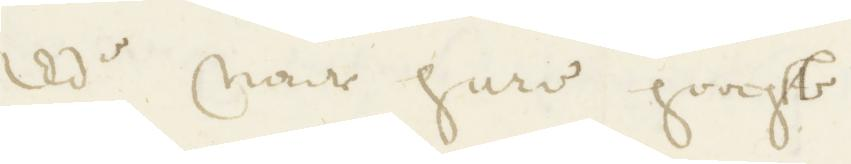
Ede naer hare hoochste wytheden alles wel
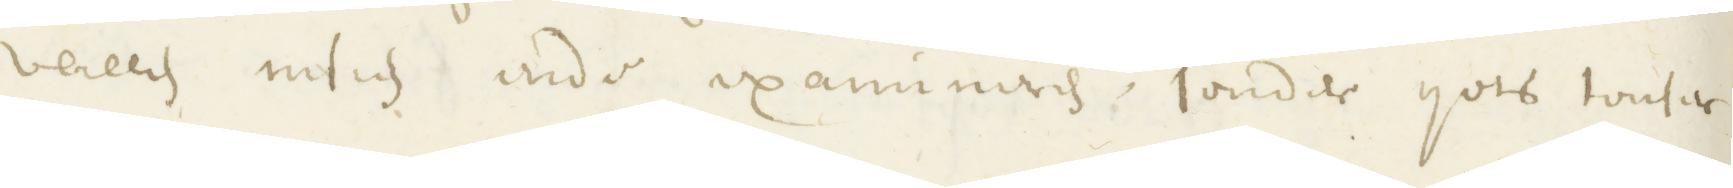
willen insien ende examineren, sonder yets tonser
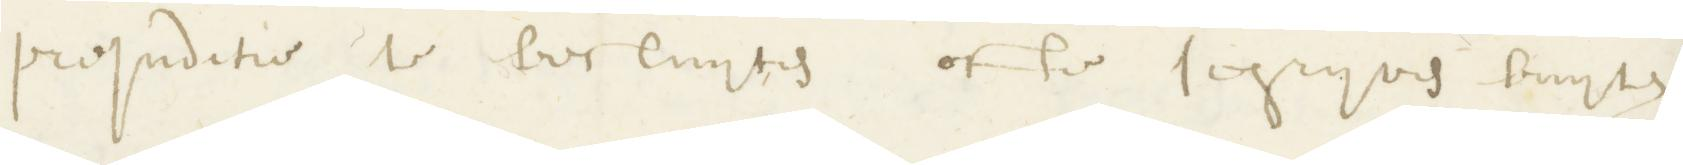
prejuditie te besluyten offe schryven buyten
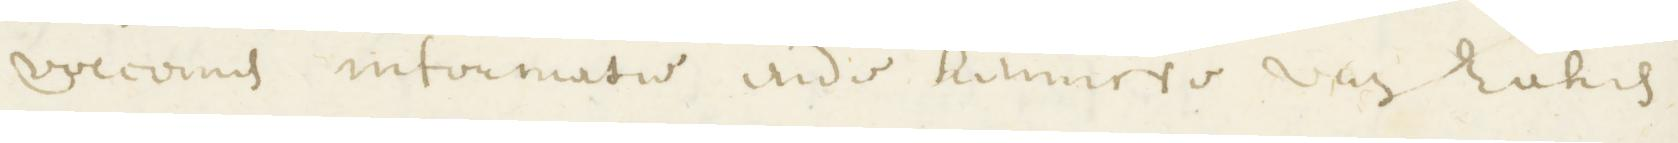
volcomen informatie ende kennisse van zaken
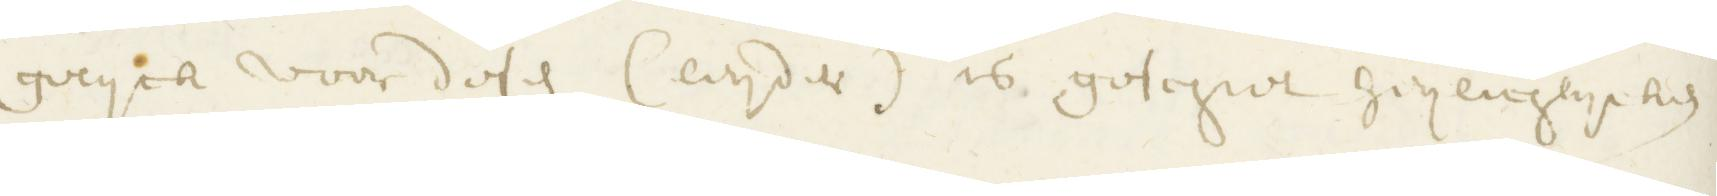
gelyck voor desen ( leyder ) is geschiet heylichlycken
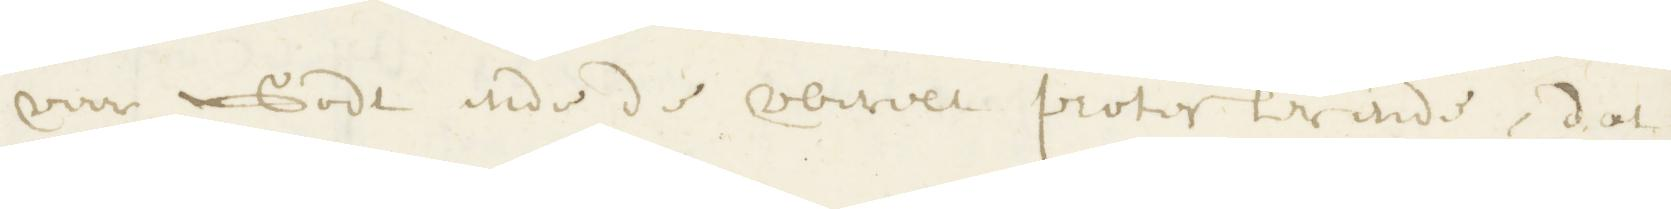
voor Godt ende de werelt protesterende, dat
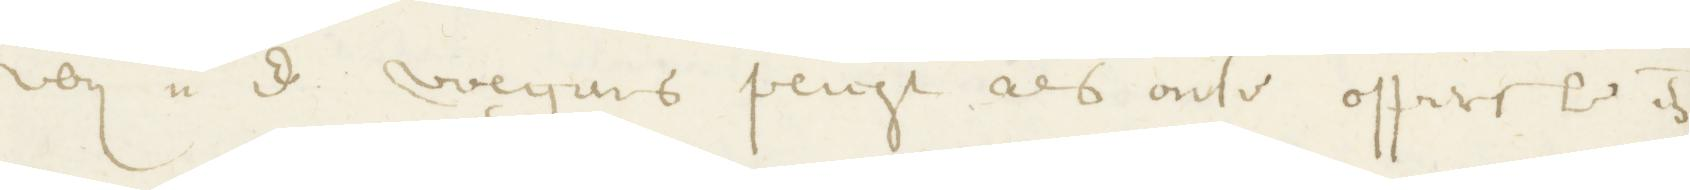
wy u E. wegens plicht als onse opperste ende
